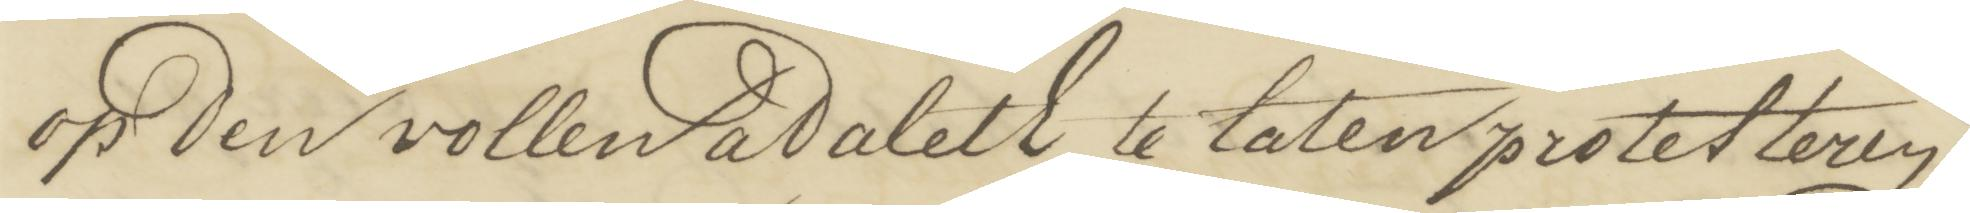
op den vollen adaleth te laten protesteren
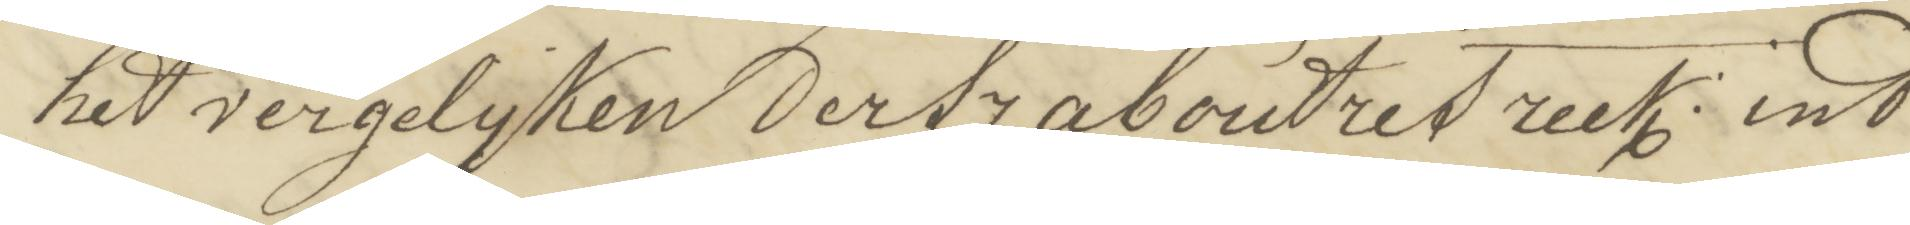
het vergelijken dersjaboutres reek: ind'
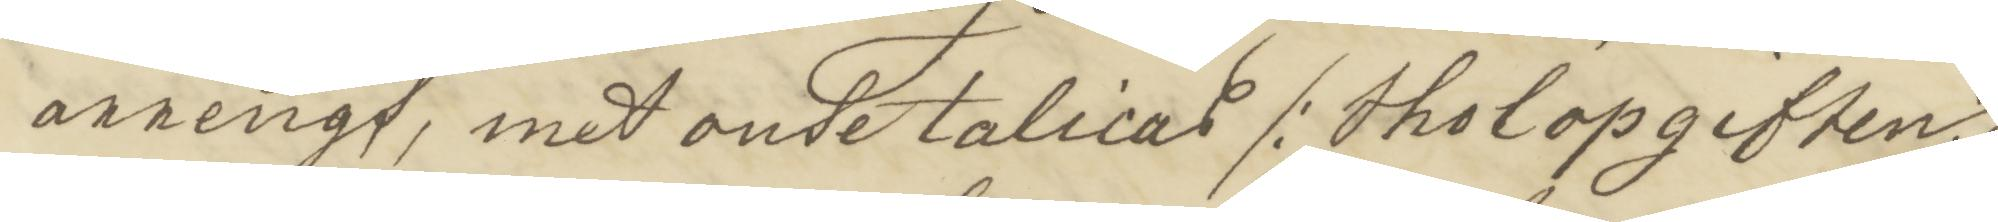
arrengs, met onse talicas /: thol op giften:/
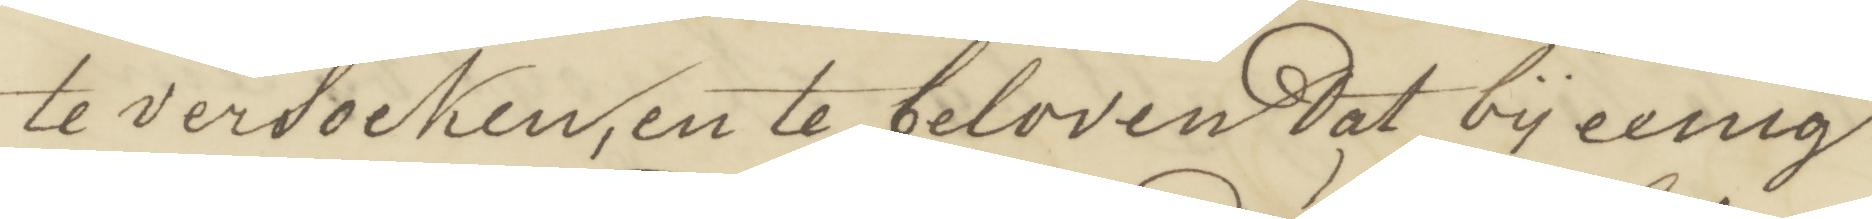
te versoeken, en te beloven dat bij eenig
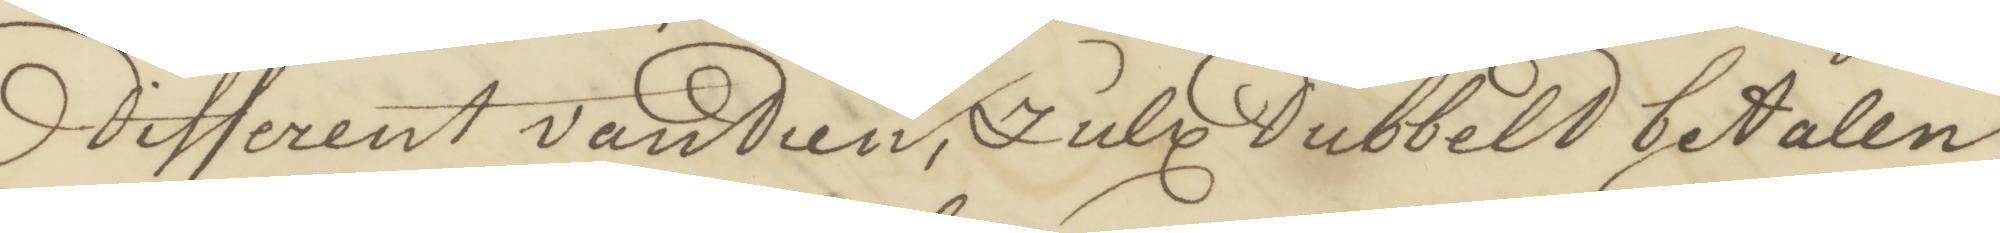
different van dien, zulx dubbeld betalen
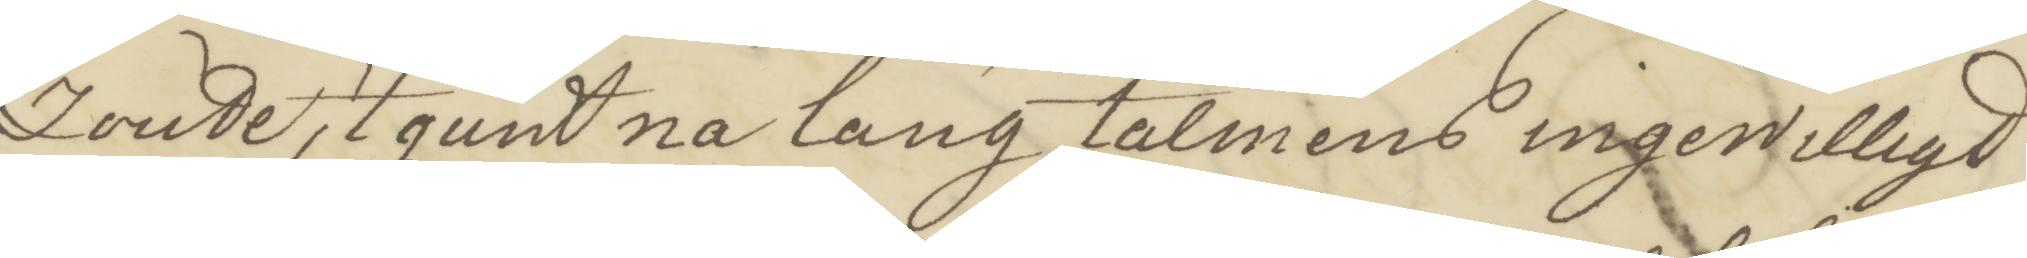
zoude, 't gund na lang talmens ingewilligd,
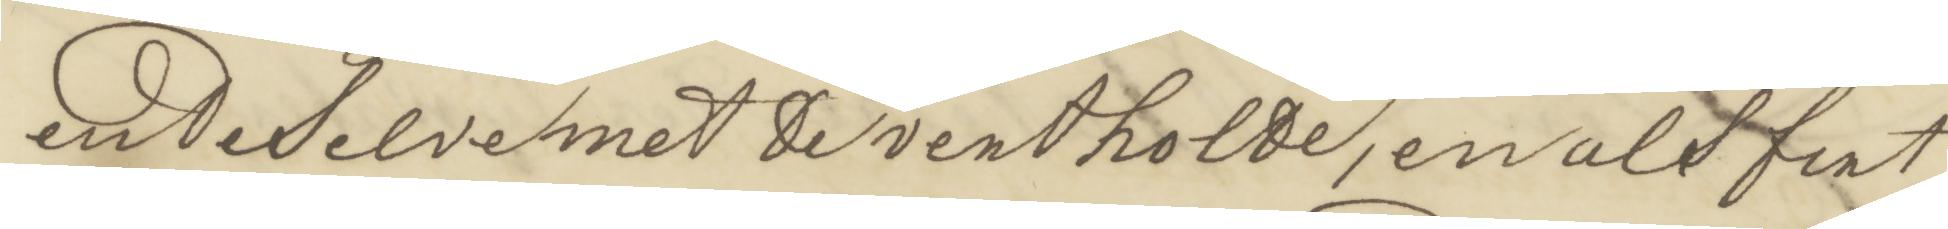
en deselve met de vertholde, en als firt
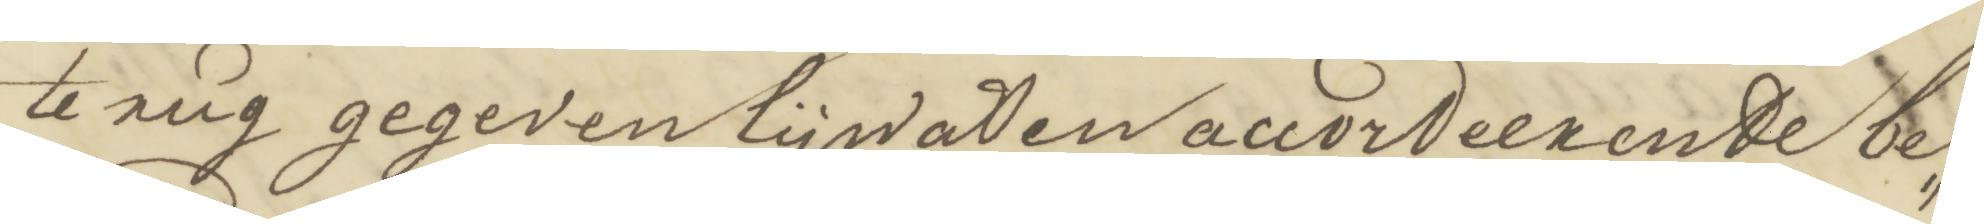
te rug gegeven lijwaten accordeerende be„
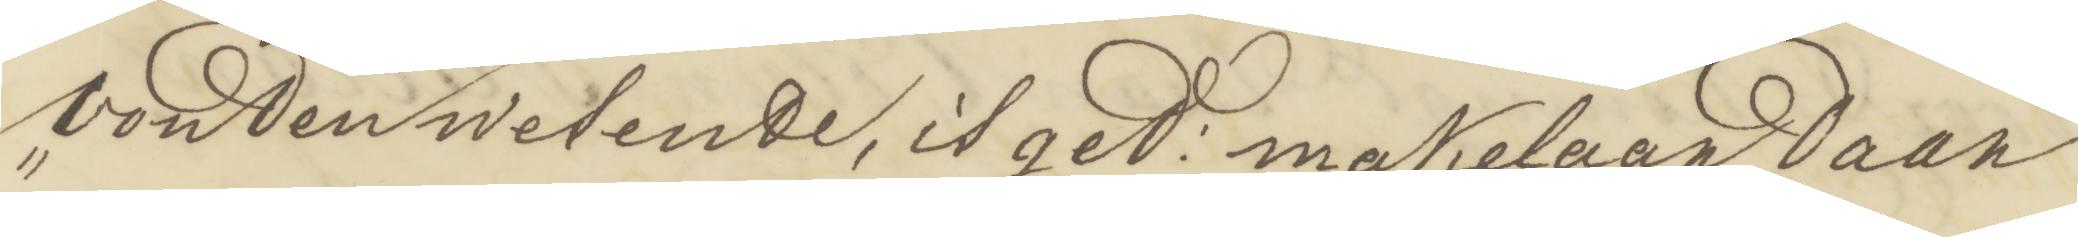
„vonden wesende, is ged: makelaar daar
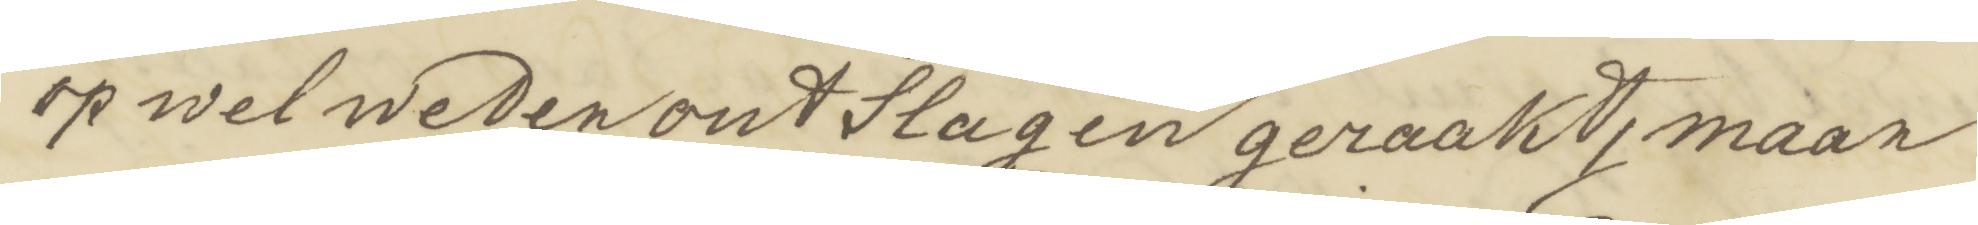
op wel weder ontslagen geraakt, maar
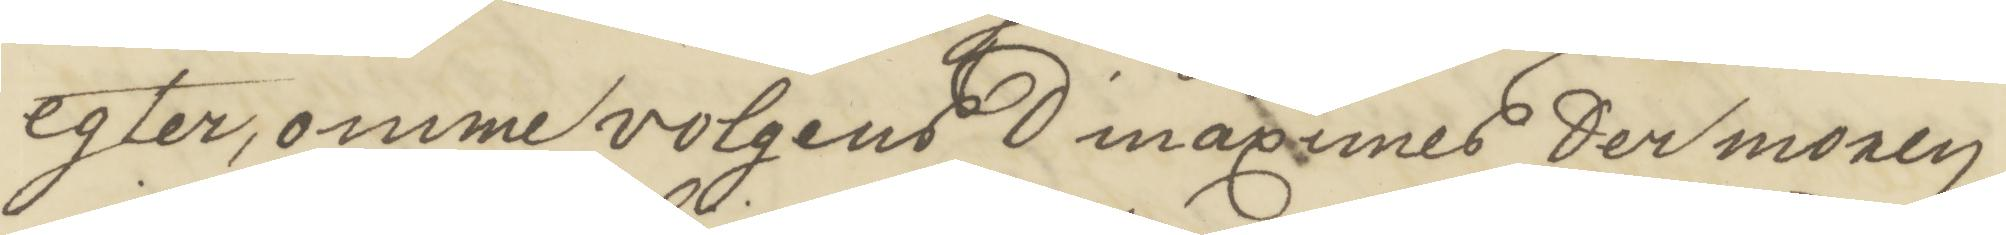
egter, omme volgens d'maximes der moren
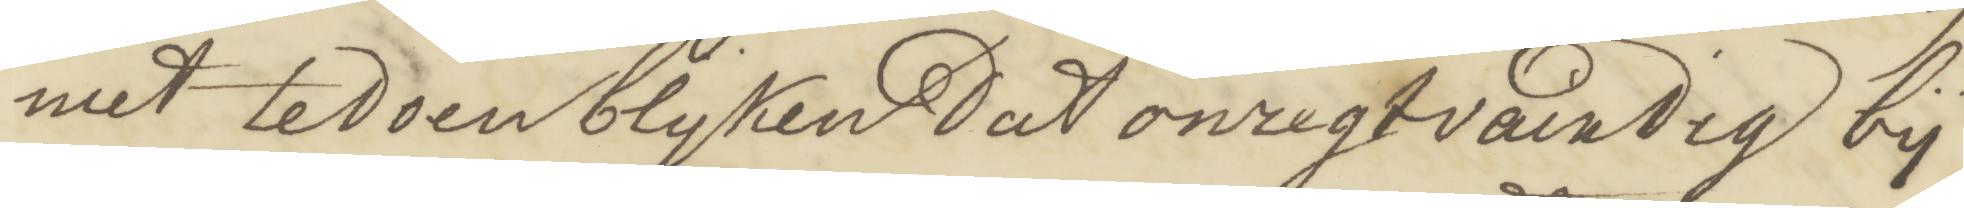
niet te doen blijken dat onregtvaerdig bij
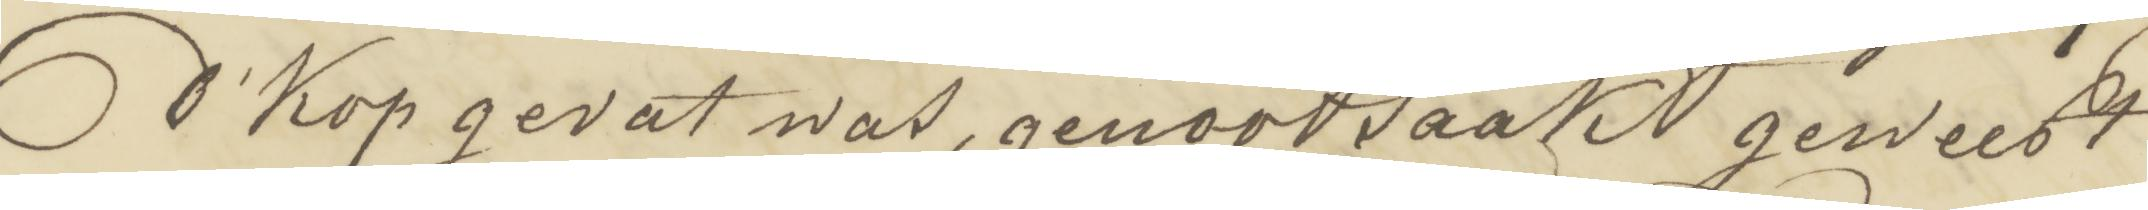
d'kop gevat was, genootsaakt geweest
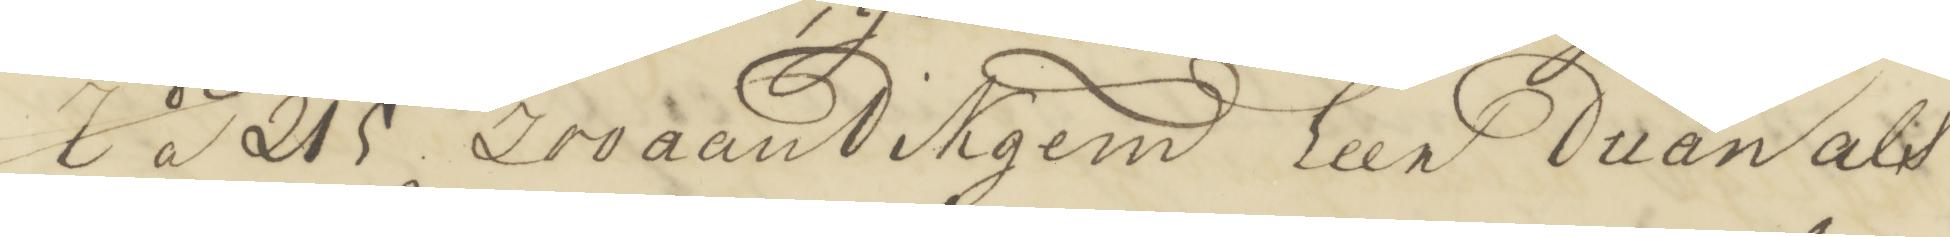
ro/a 215. zoo aan dikgem heer duan als
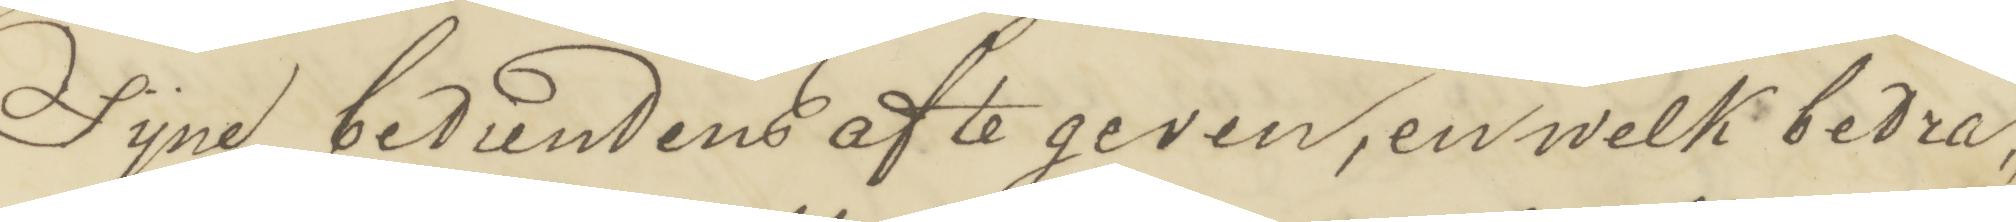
Sijne bediendens af te geven, en welk bedra„
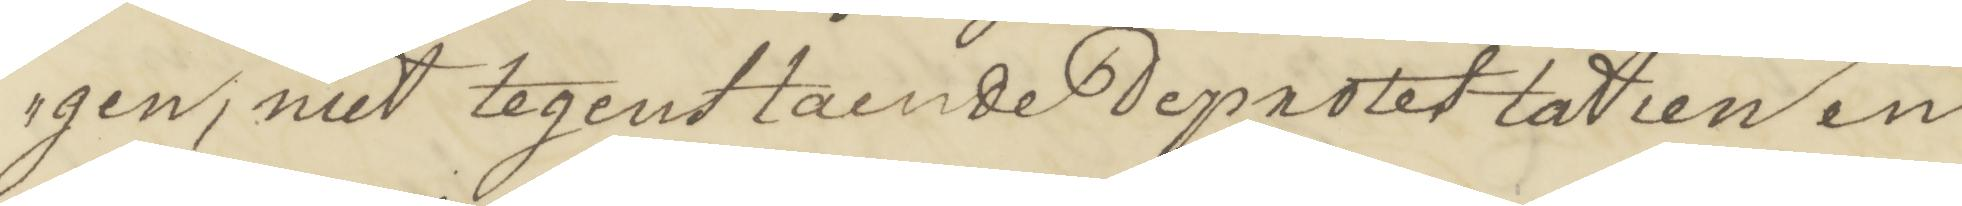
„gen, niet tegenstaende de protestatien en
